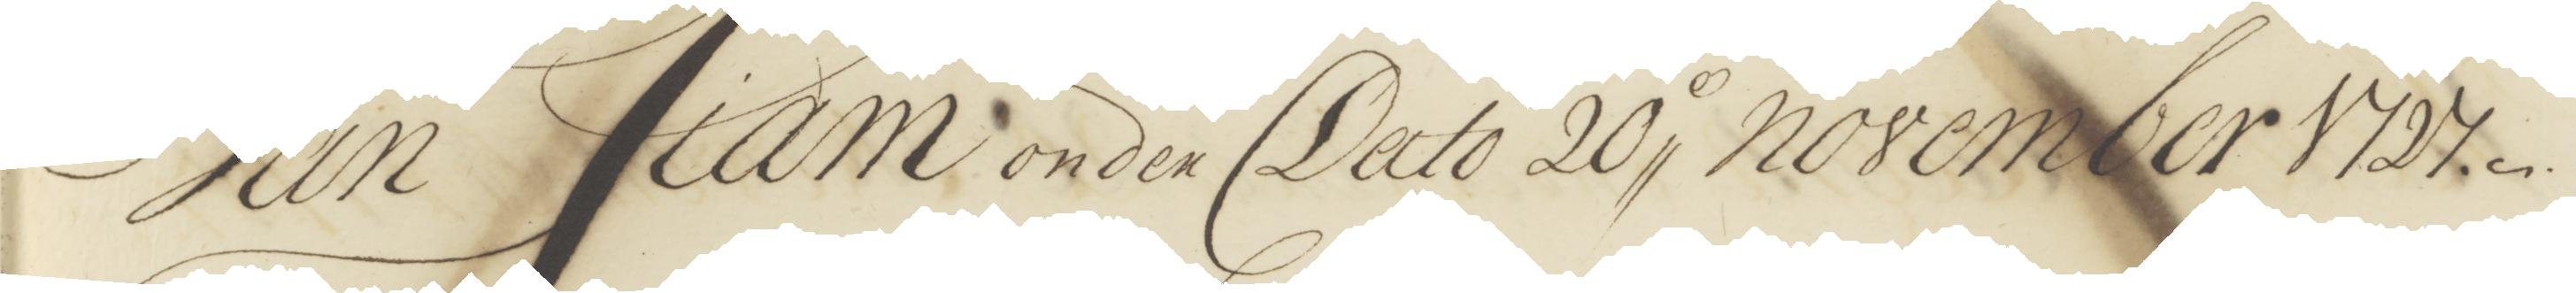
Van Siam onder Dato 20„e november 1727. — .
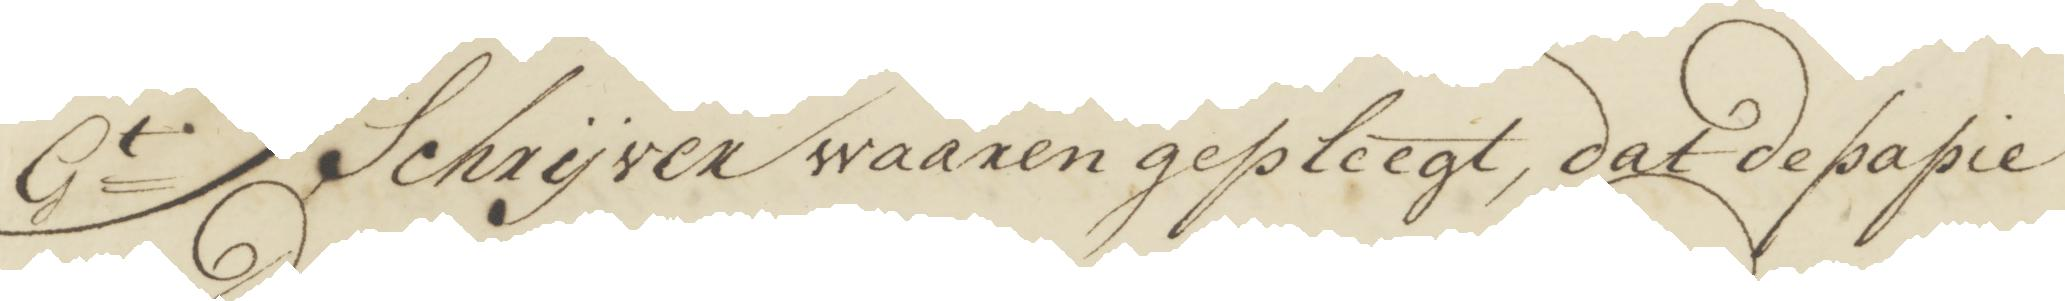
G=t schrijver waaren gepleegt, dat de papie
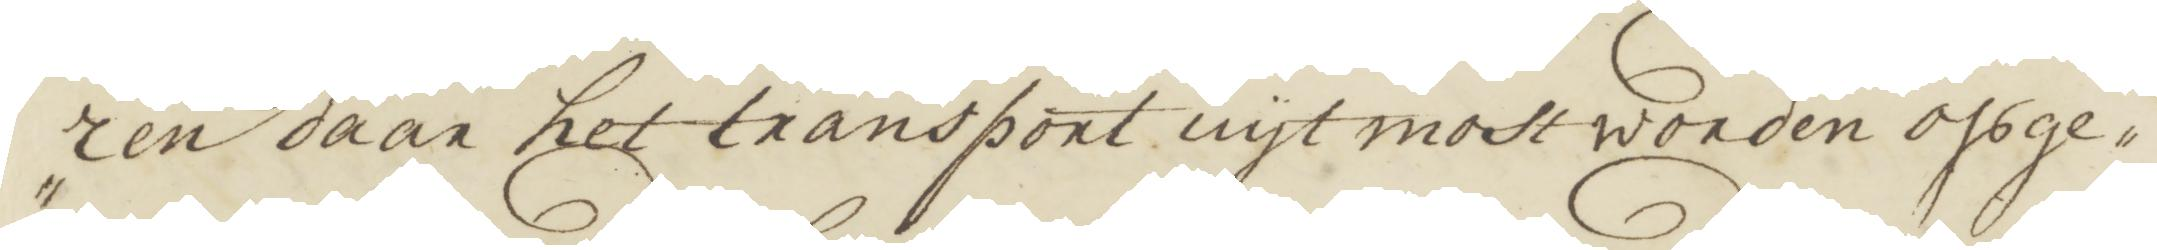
„ren daar het transport uijt most worden opge„
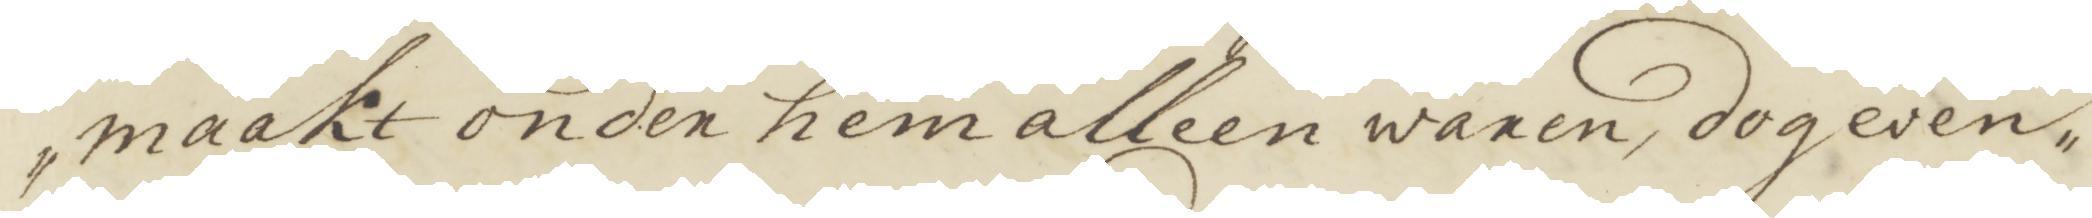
„maakt onder hem alleen waren, dog even„
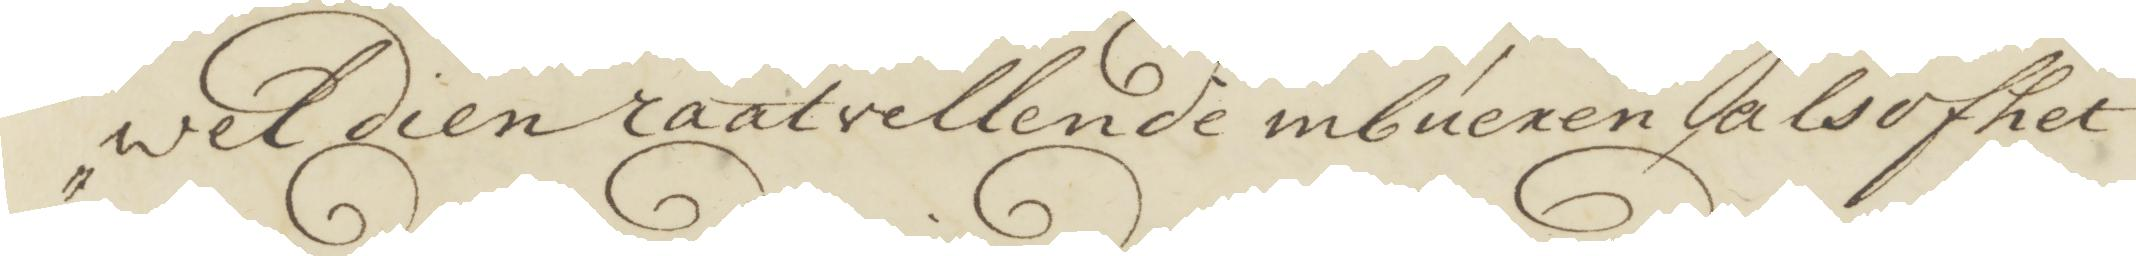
„wel dien raatvellende inbueren, als of het
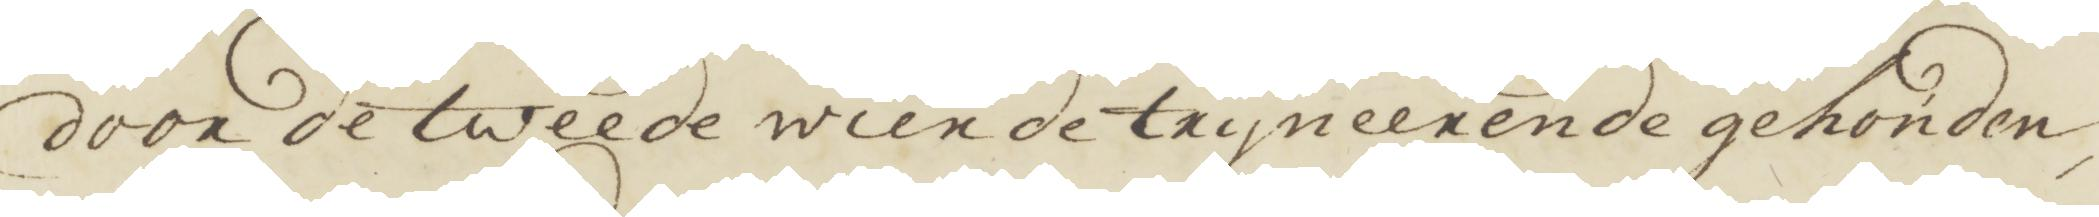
door de tweede wierde trijneerende gehouden,
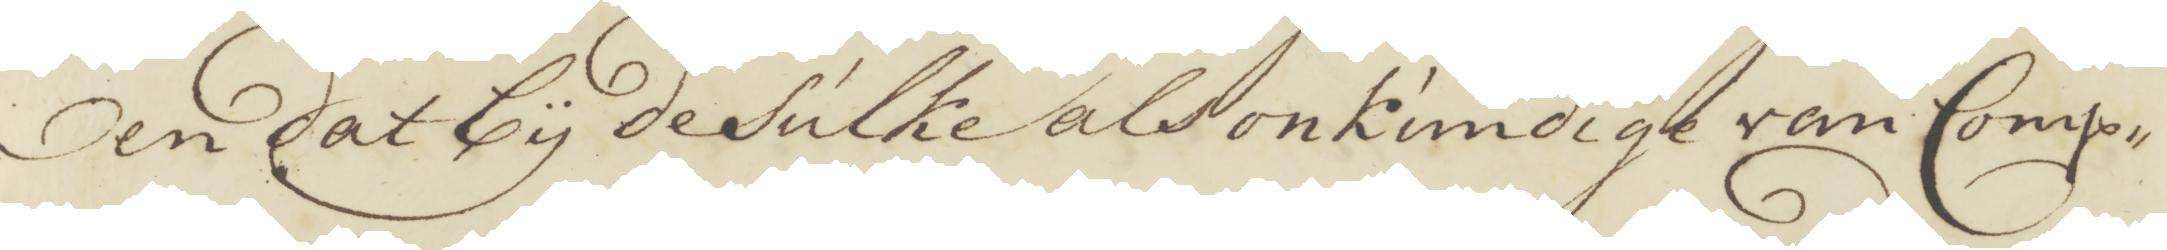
en dat bij de sulke als onkundige van Comp„
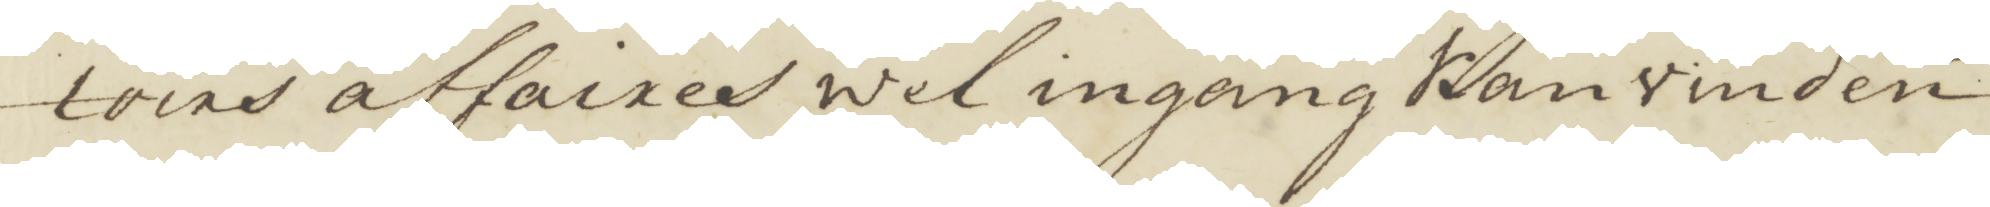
toirs affaires wel ingang kan vinden
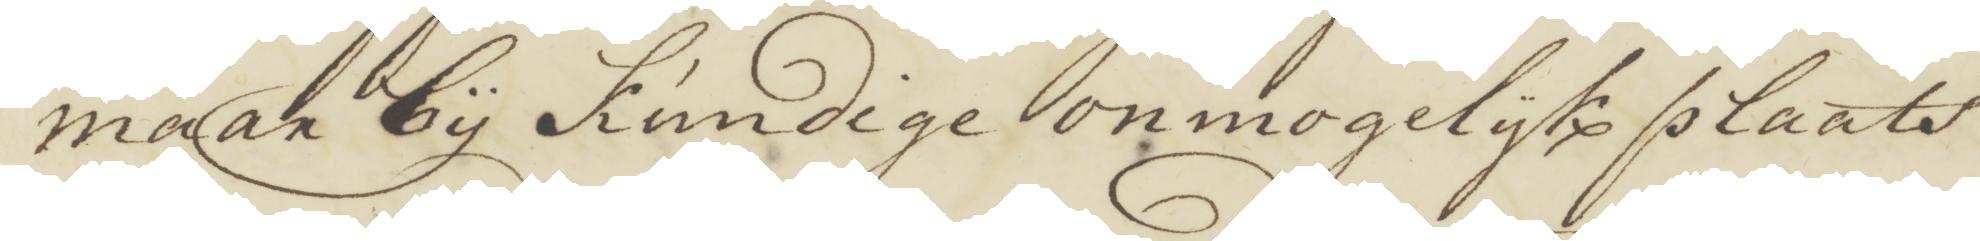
maar bij kundige onmogelijk plaats
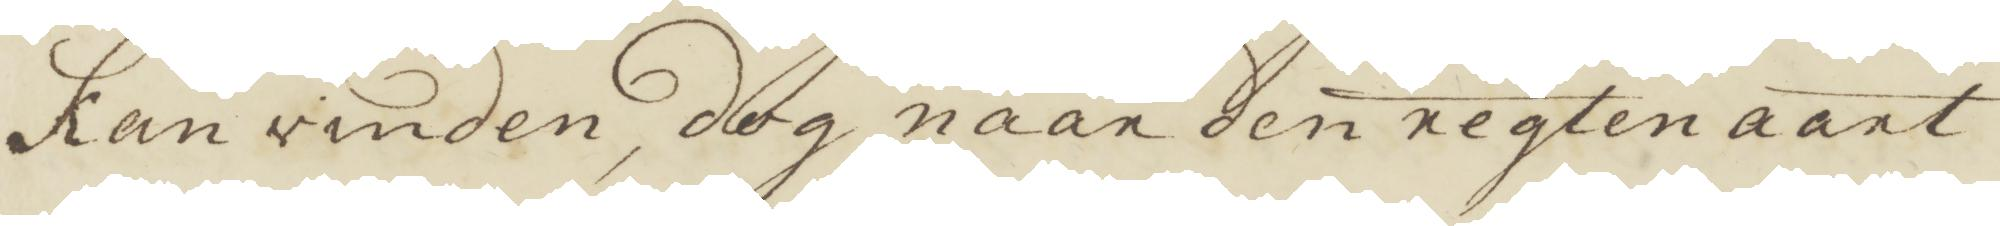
kan vinden, dog naar den regten aart
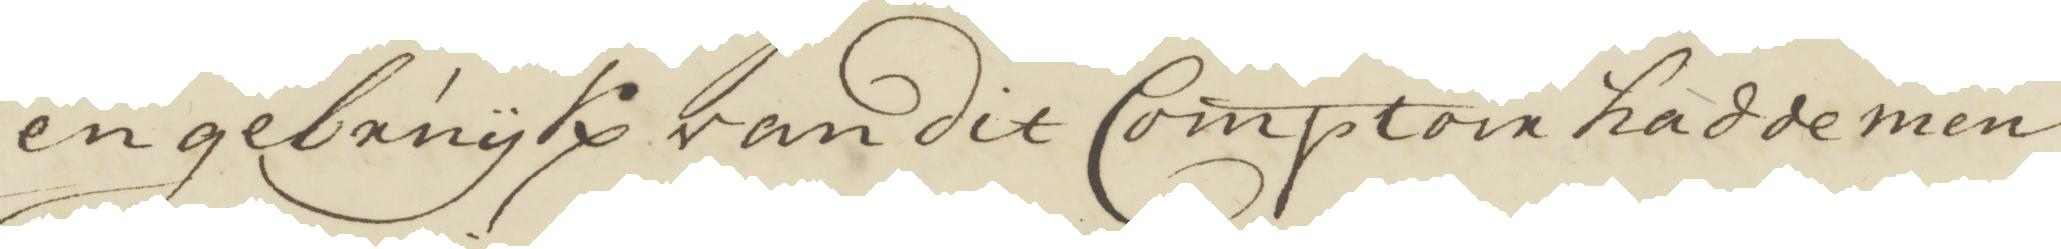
en gebruijk van dit Comptoir hadde men
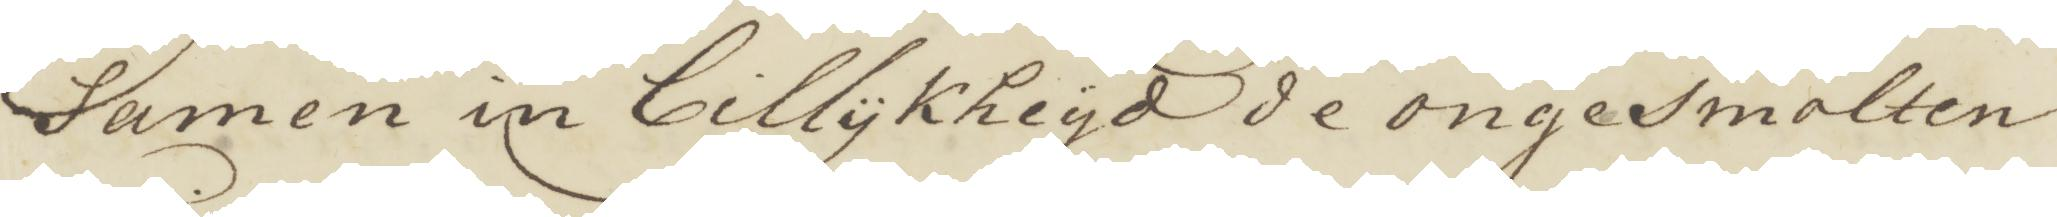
samen in billijkheijd de ongesmolten
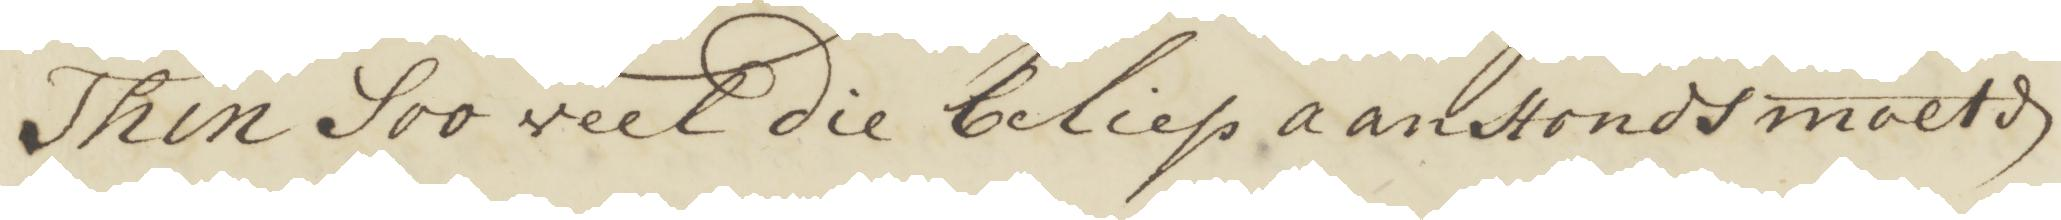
Thin soo veel die beliep aanstonds moeten
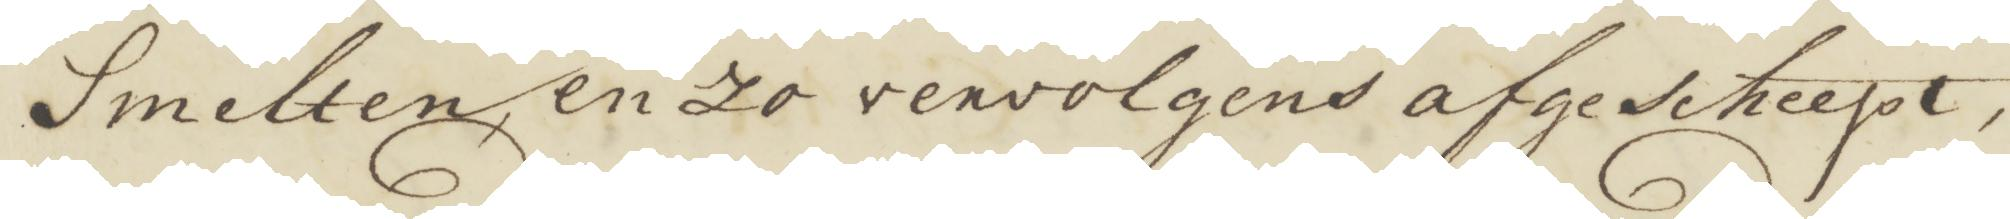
smelten, en zo vervolgens afgescheept,
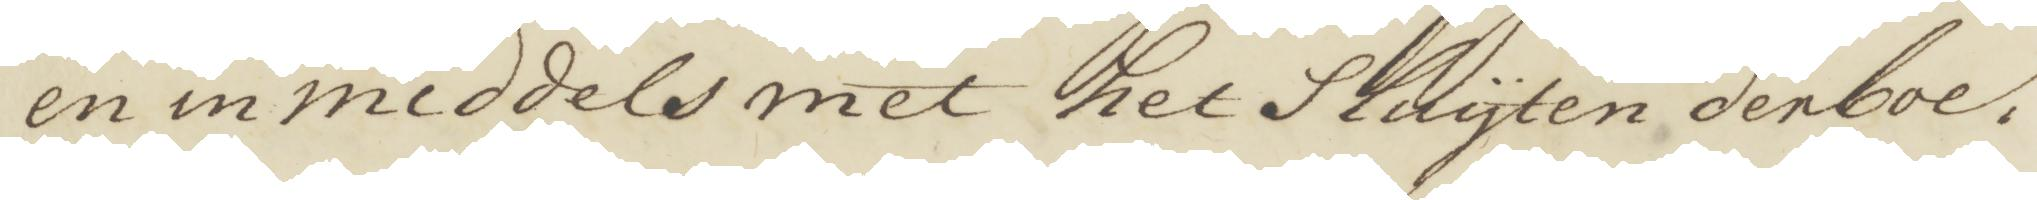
en inmiddels met het sluijten derboe„
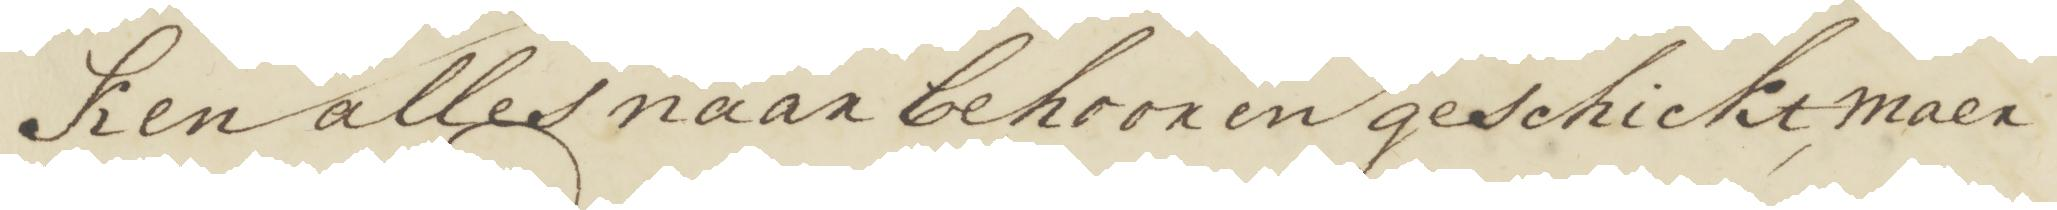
ken alles naar behooren geschickt, maer
